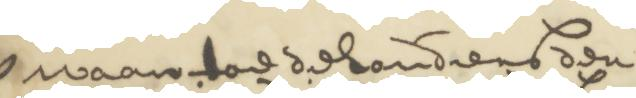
waar toe de houders den
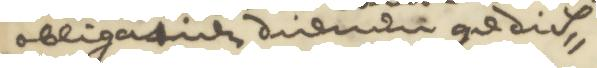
obligatien dienen gedis„
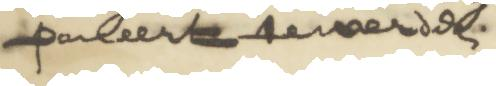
poneert te werden
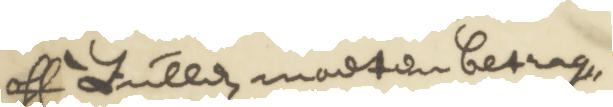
off zullen moeten betrag„
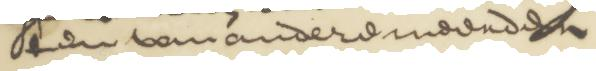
ten van andere meerder
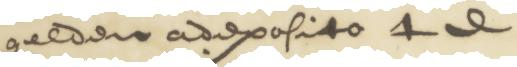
gelden adeposito te
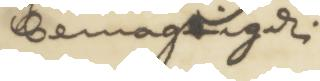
bemagtigen
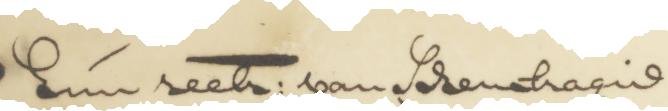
hun reek: van schenckagie
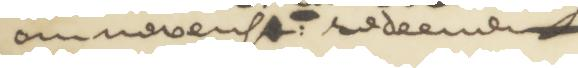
om nevenst:' redeenen
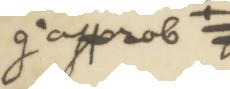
g’approb=t
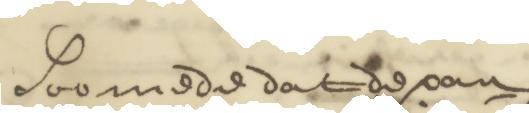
soo mede dat de par
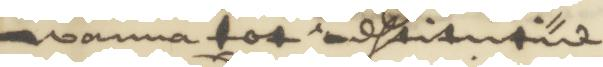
wanna tot restitutie
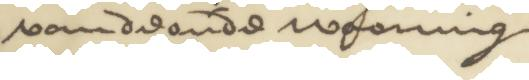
van de oude wooning
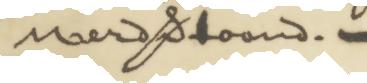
werd vertoond. —
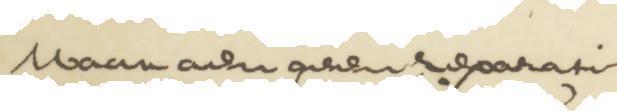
waar aen geen reparatie
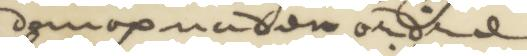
dair op nader ordre
